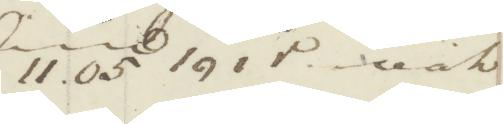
11.05 191 V. Vak
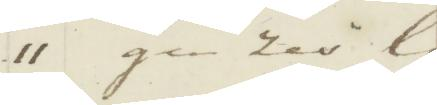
1.11 gen zes
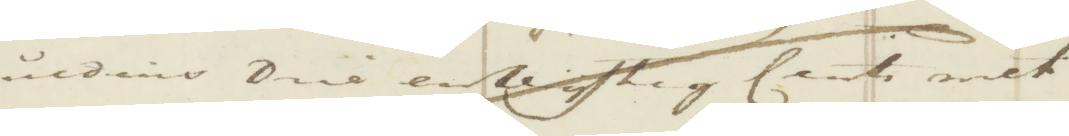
Guldens drie en vijftig Cents met
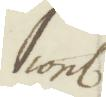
10pct
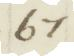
1.67
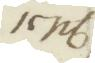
15pct
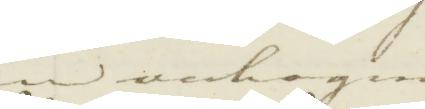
verhoging
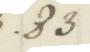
.83
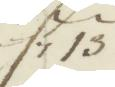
ƒ 13
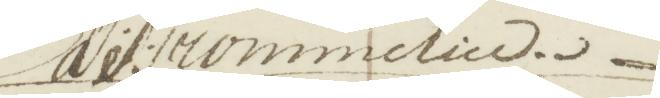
D:F:Crommelin.-—
